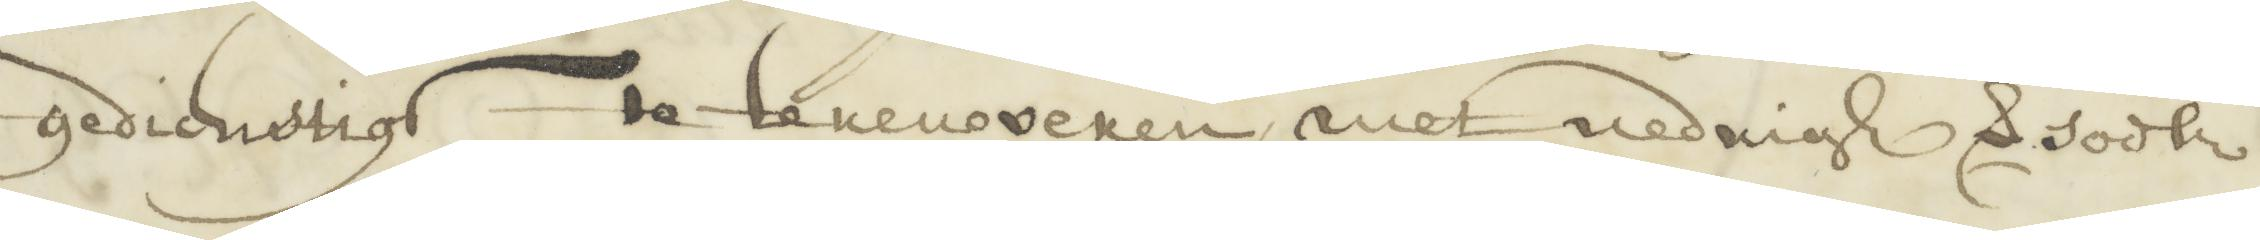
gedienstigste terenoveren, met nedrigh versoek
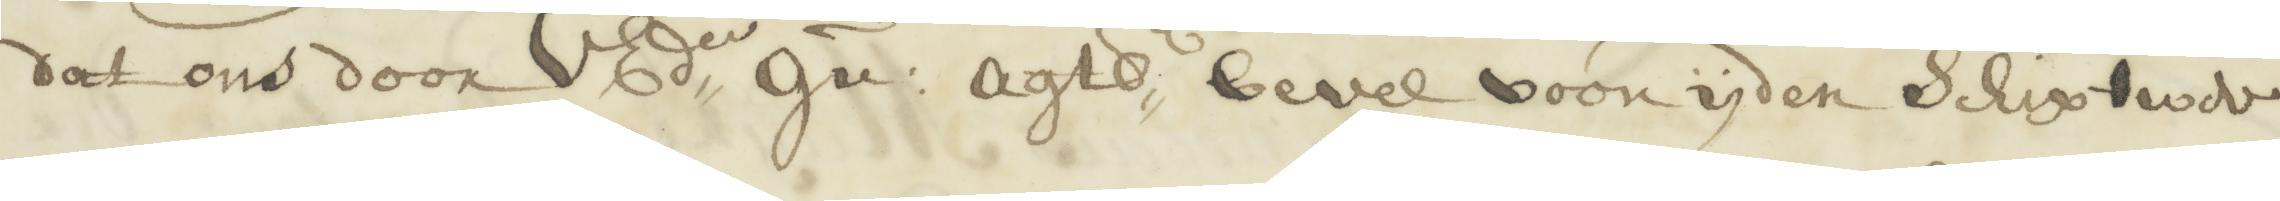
dat ons door VEd„en gr: agtb„re bevel voor ijder schip twee
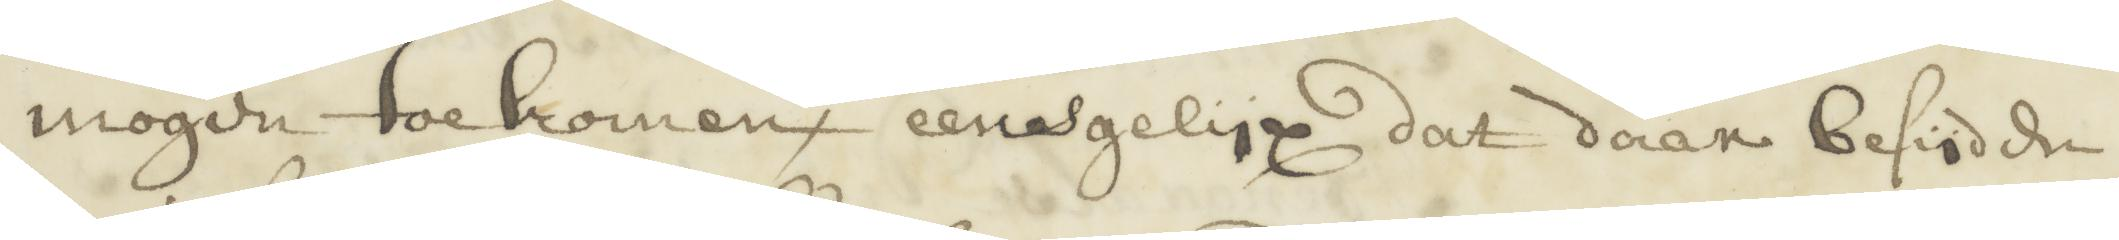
mogen toekomen, eensgelijx dat daar besijden
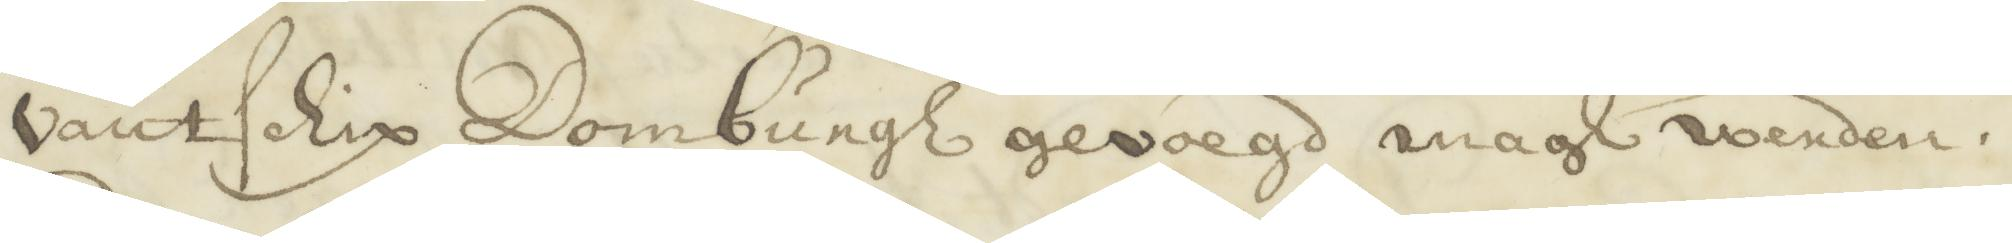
van’t schip Domburgh gevoegd magh werden.
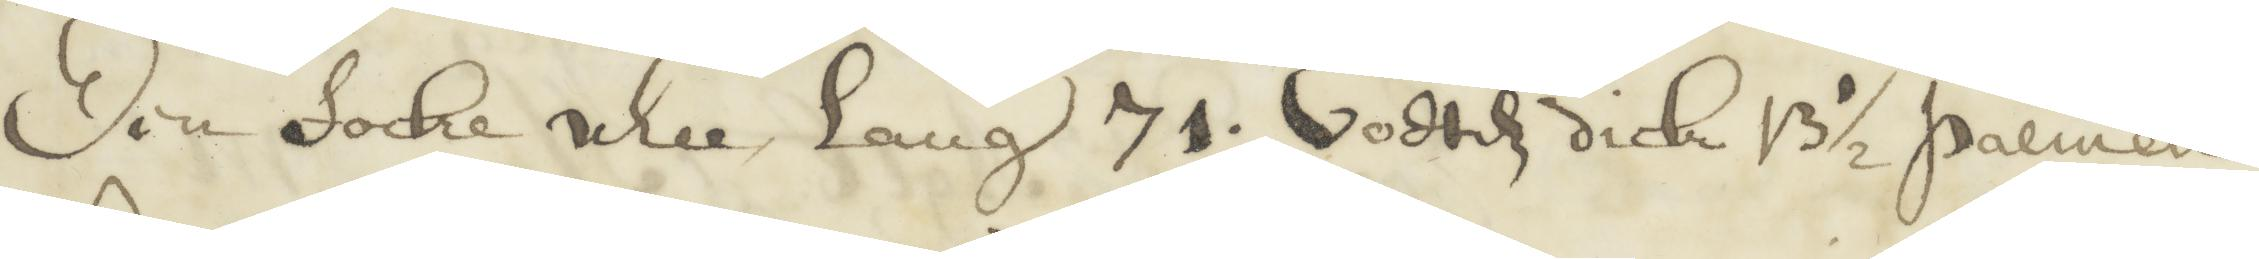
Een focke rhee, lang 71. voeten dick 13½ palmen
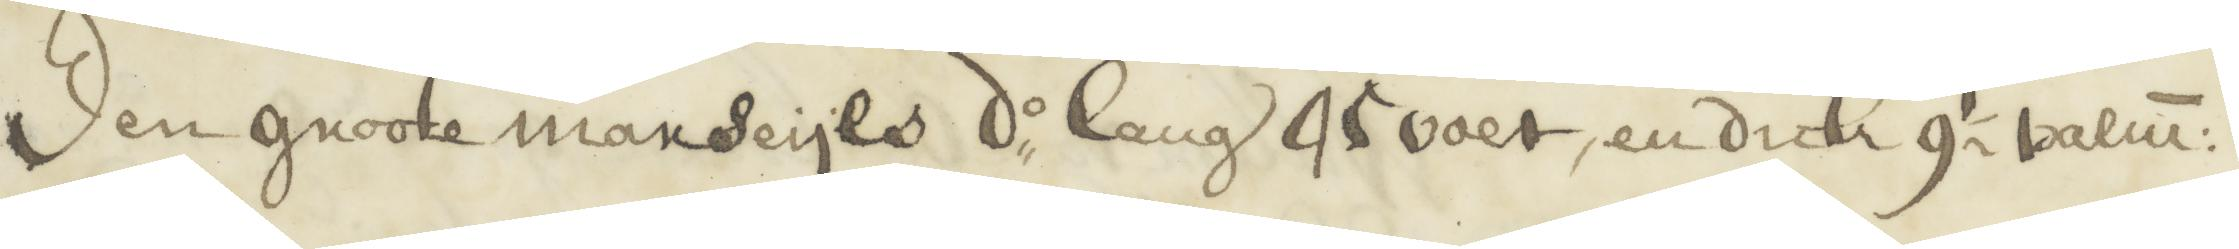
Den groote manseijls d„o lang 45 voet, en dick 9½ palm:
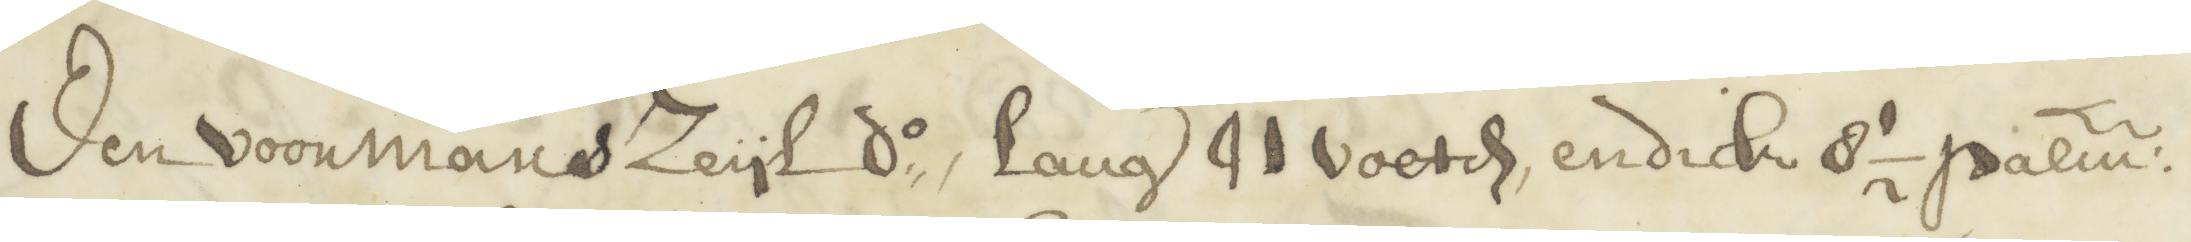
Een voormans zeijl d„o, lang 41 voeten, en dick 8½ palm:
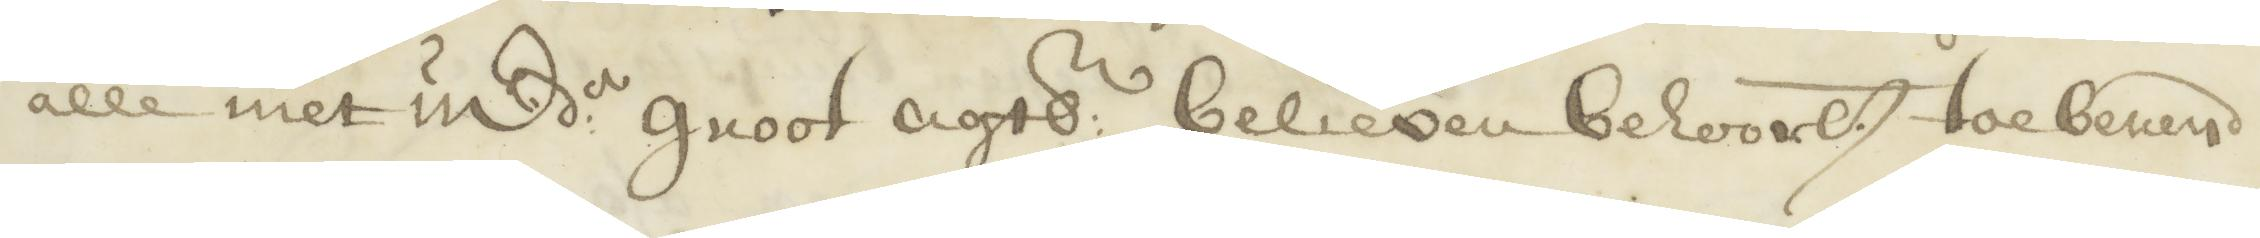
alle met uEd:le groot agtb:re believen behoorlijk. toebereyd
